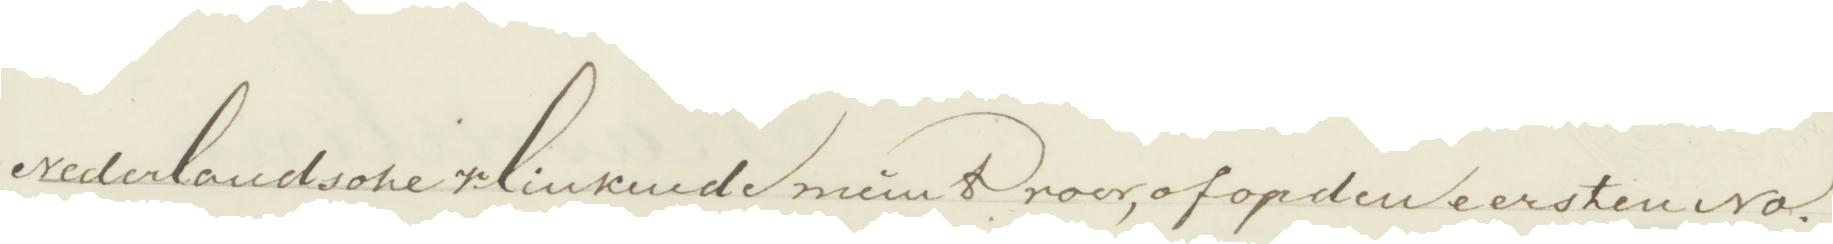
Nederlandsche klinkende munt voor, of op den eersten No.
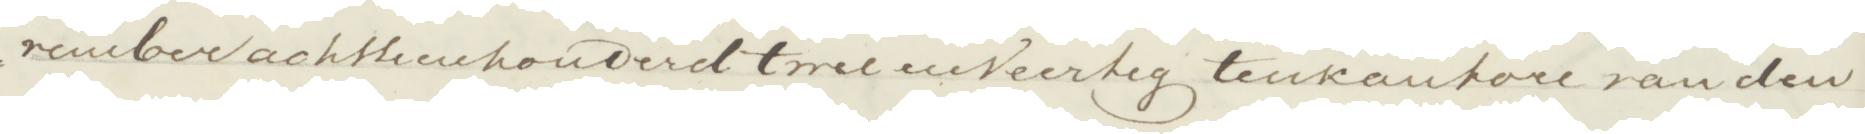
vember achttienhonderd twee en Veertig ten kantore van den
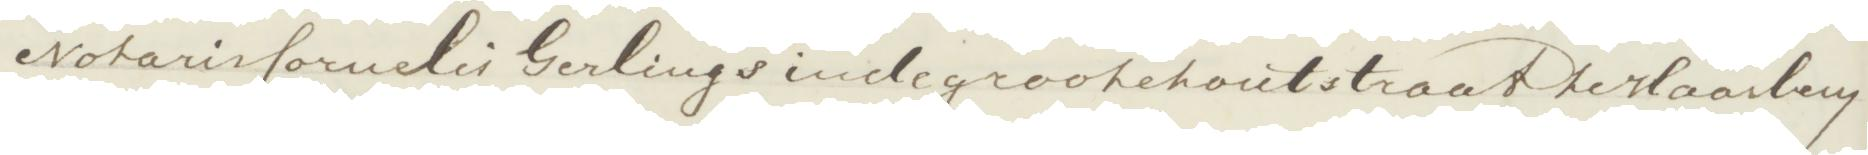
Notaris Cornelis Gerlings in de grootehoutstraat te Haarlem
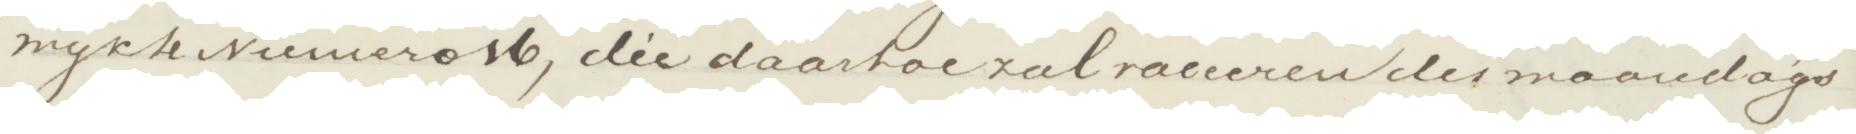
wyk 4 Numero 16, die daartoe zal vaceeren des maandags
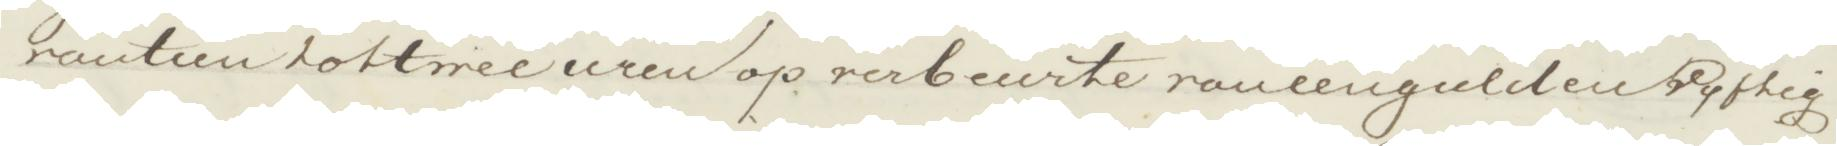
van tien tot twee uren op verbeurte van een gulden vyftig
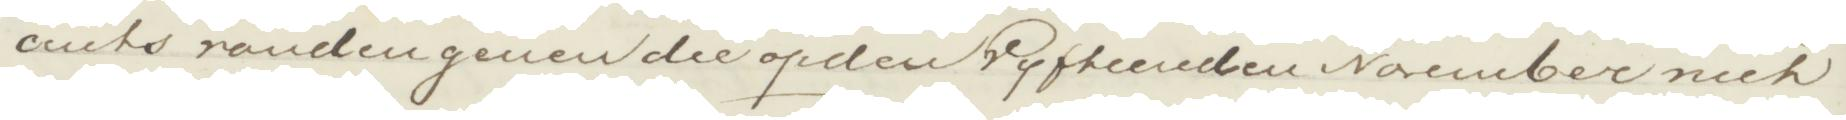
cents vanden genen die op den Vyftienden November niet
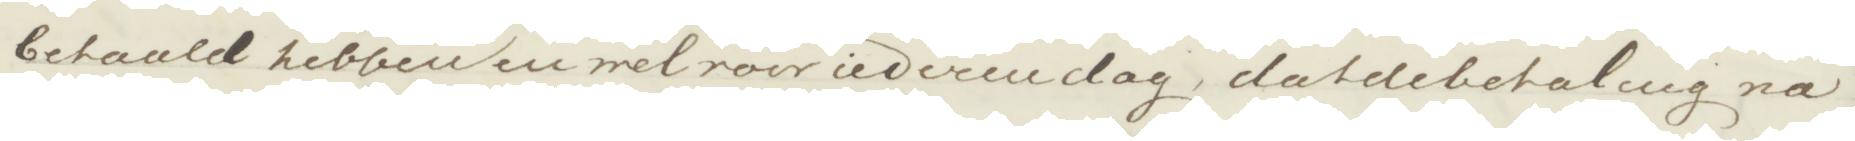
betaald hebben en wel voor iederen dag, dat de betaling na
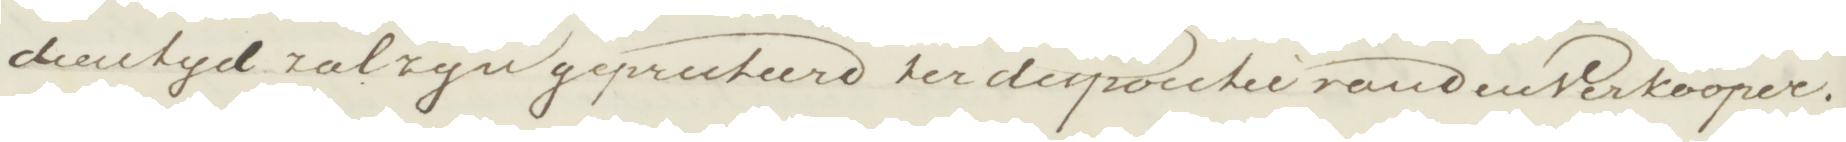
dientyd zal zyn gepresteerd ter dispocitie van den Verkooper.
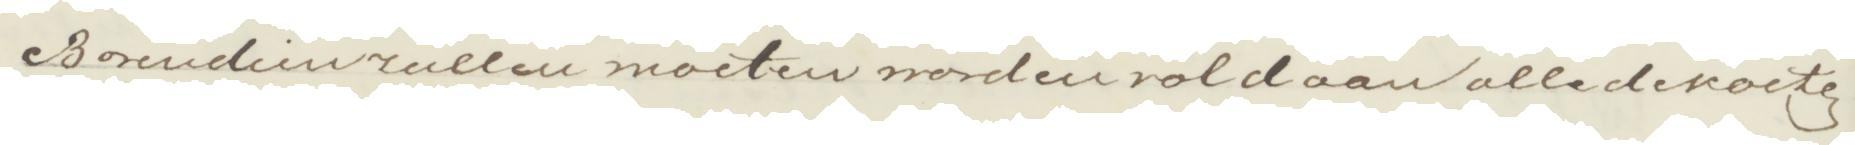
Bovendien zullen moeten worden voldaan alle de voeten
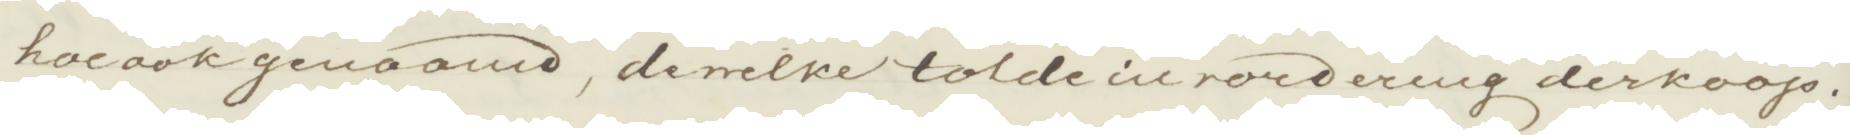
hoe ook genaamd, dewelke tot de invordering der koop.
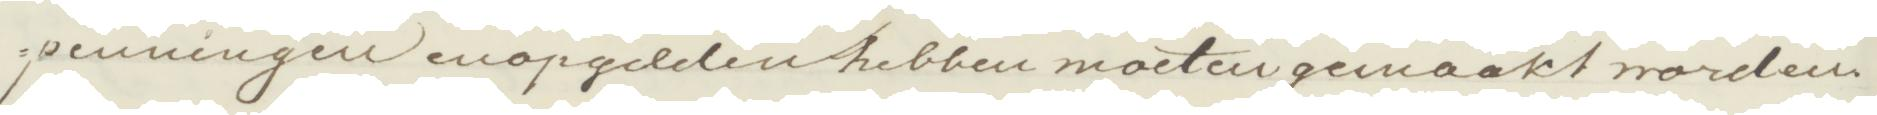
=penningen en opgelden hebben moeten gemaakt worden.
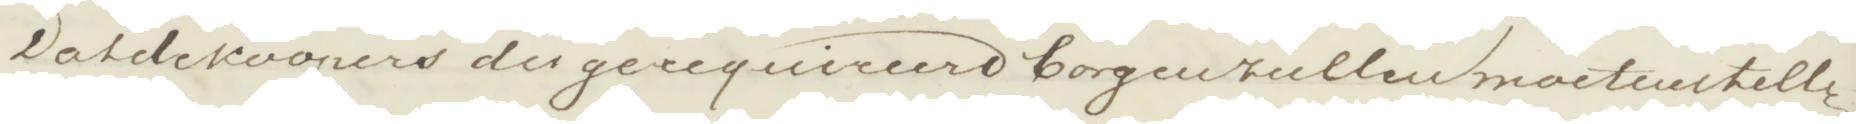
Dat de koopers des gerequireerd borgen zullen moeten stellen
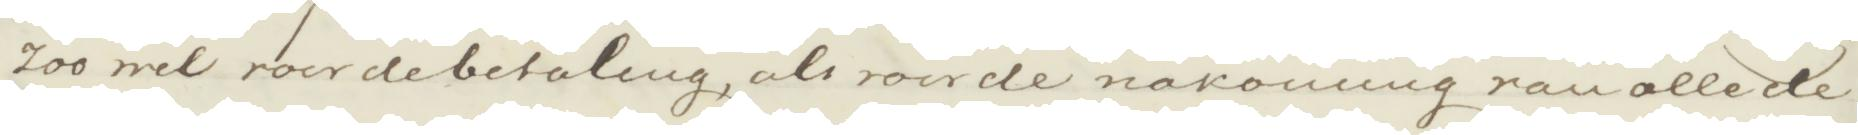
zoo wel voor de betaling, als voor de nakoming van alle de
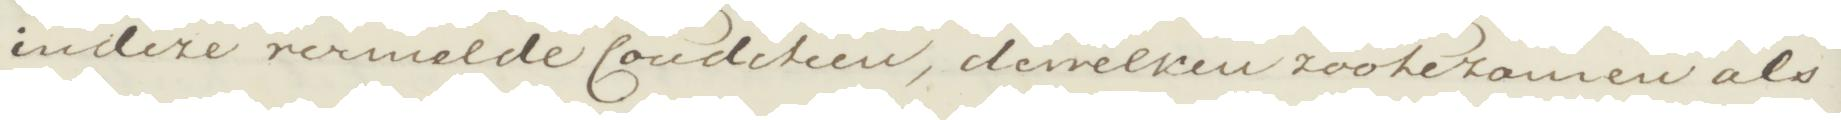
in deze vermelde Conditien, dewelken zoo tezamen als
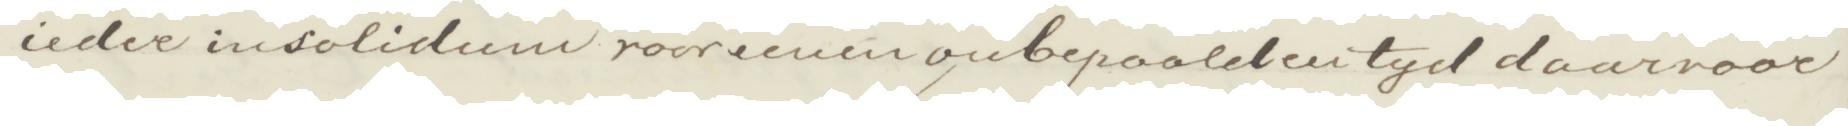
ieder in solidum voor eenen onbepaalden tyd daarvoor
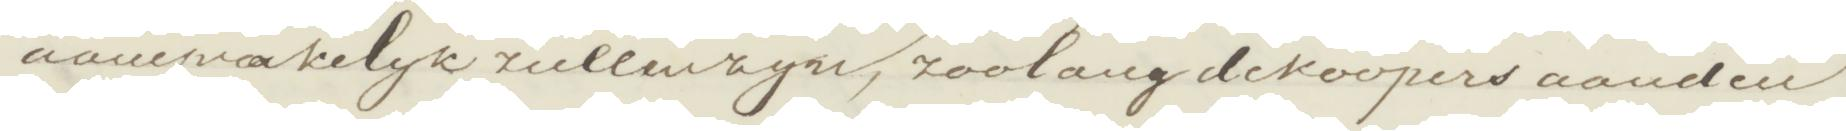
aansprakelyk zullen zyn, zoolang de koopers aanden
